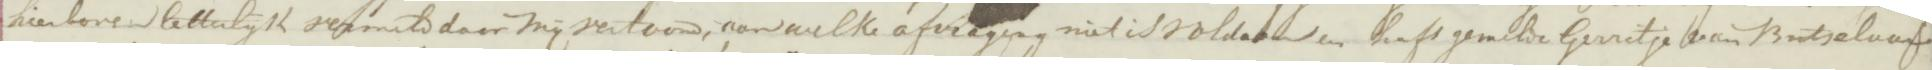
hierboven letterlijk vermeld door mij vertoond, aan welke afvraging niet is voldaan en heeft gemelde Gerritje van Butselaar
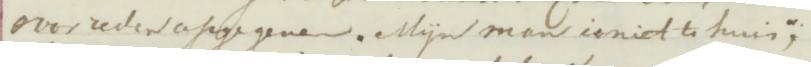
voor reden opgegeven „Mijn man is niet te huis",
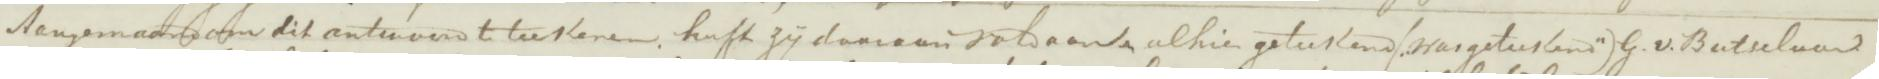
Aangemaand om dit antwoord te teekenenen, heeft zij daar aan voldaan en alhier geteekend („was geteekend") G. v. Butselaar
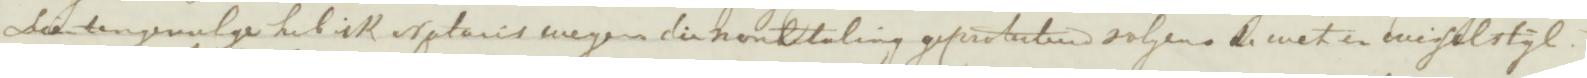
dien ten gevolge heb ik Notaris wegen die nonbetaling geprotesteerd volgens te wet en wisselstijl.
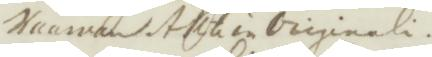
Waarvan Akte in Originali.
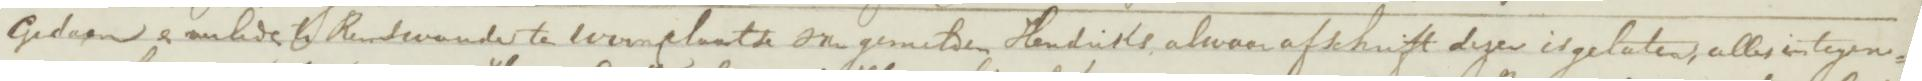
Gedaan en verleden te Renswoude ter woonplaatse van gemelden Hendriks, alwaar afschrift dezer is gelaten, alles in tegen„
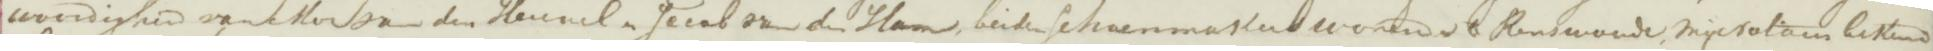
woordigheid van Mor van den Heuvel en Jacob van den Ham, beiden schoenmakers wonend te Renswoude, mij Notaris bekend
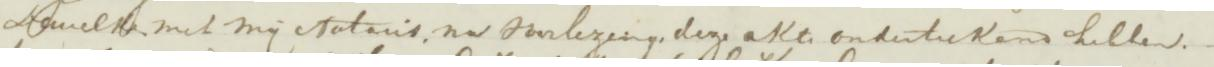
Dewelke met mij Notaris, na voorlezing, deze akte onderteekend hebben.
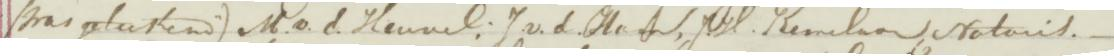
(Was geteekend) M. v. d. Heuvel: J v. d. Ham, J H. Kemelaar, Notaris.
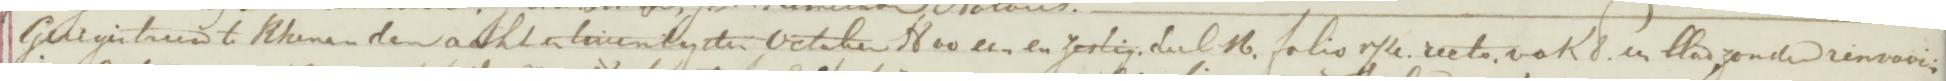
Geregistreerd te Rhenen den acht entwintigsten October 1800 een en zestig, deel 16. folio 174. recto, vak 8. een blad, zonder renvooi:
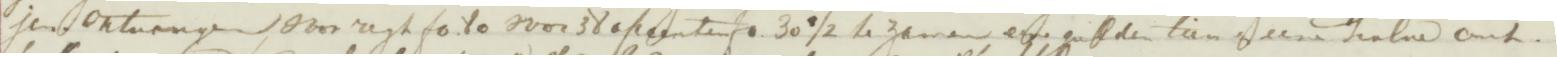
jen Ontvangen voor regt ƒ0.80 voor 38 opCenten ƒ0.30½ te zamen een gulden tien en een halve cent.
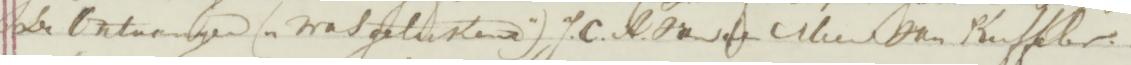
De Ontvanger („was geteekend") J. C. A. Van de Meer van Kuffeler:
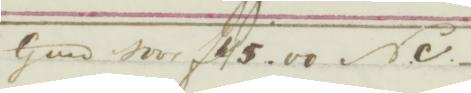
Goed voor ƒ45.00 Nc.
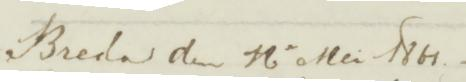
Breda den 16 Mei 1861.
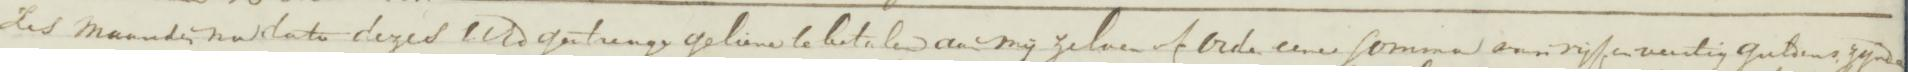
Zes maanden na dato dezes UEd gestrenge gelieve te betalen aan mij zelven of order eene Somma van vijfen veertig guldens zynde
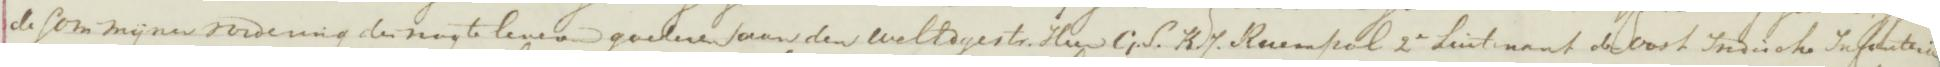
de som mijner vordering der nog te leveren goederen aan den WelEdgestr Heer G S. K. J. Ruempol 2e Luitinant der Oost Indische infanterie
